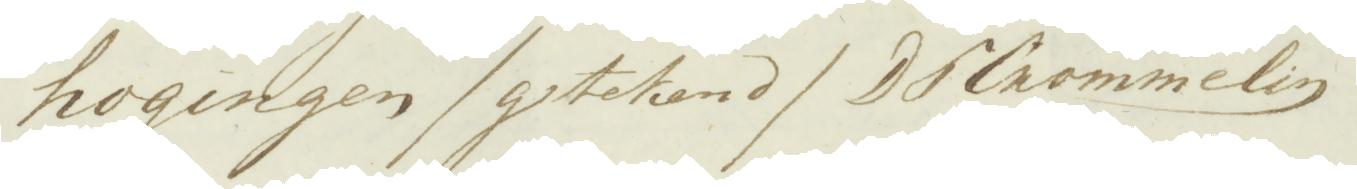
hogingen / getekend/ D. T Crommelin
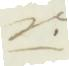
V.
